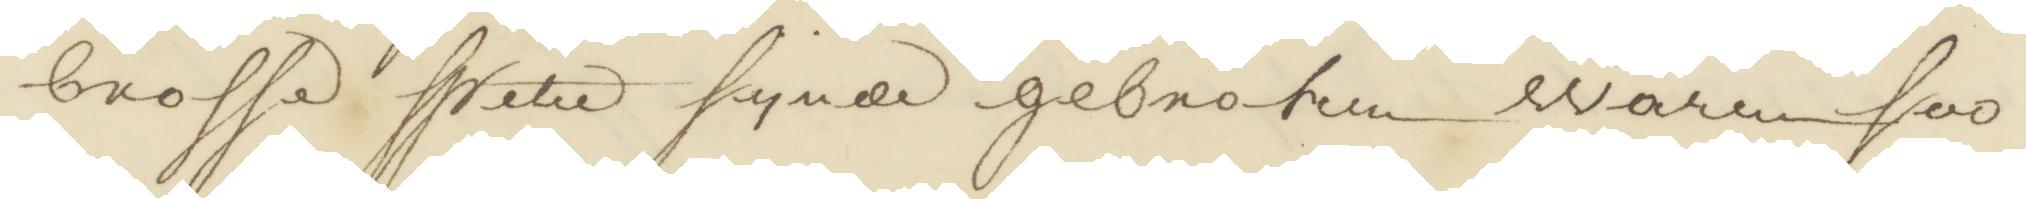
brosse spetie sijnde gebroken waren soo
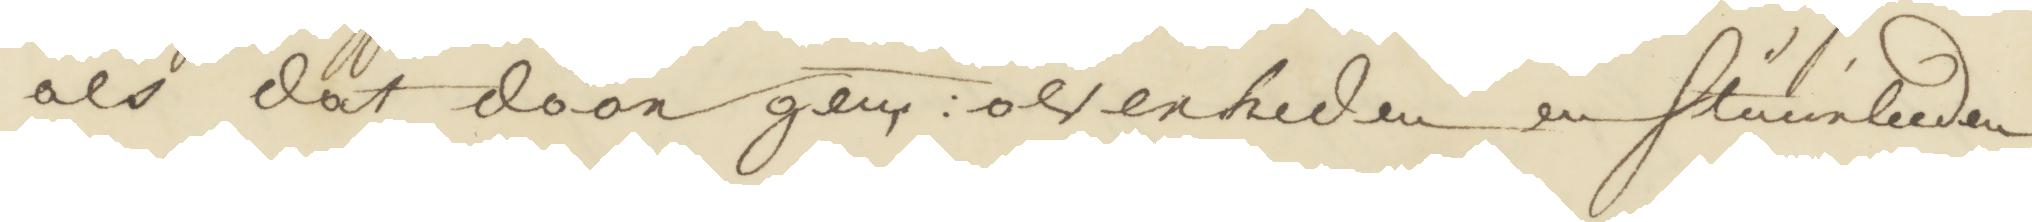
als dat door gem: overheden en stuurleeden
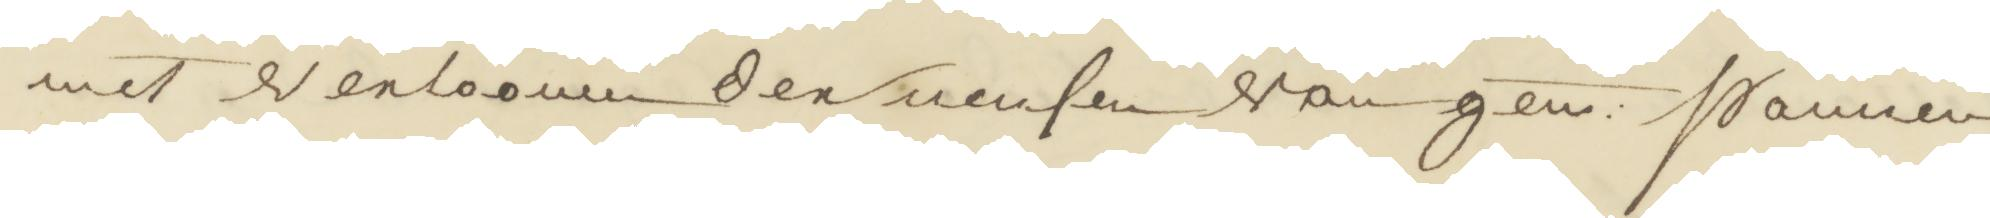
met vertoonen der neusen van gem: pannen
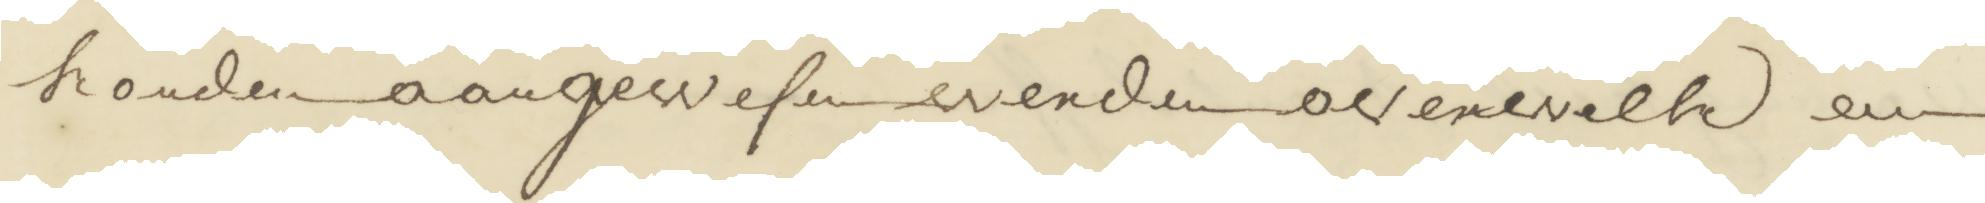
konden aangewesen werden overwelk en
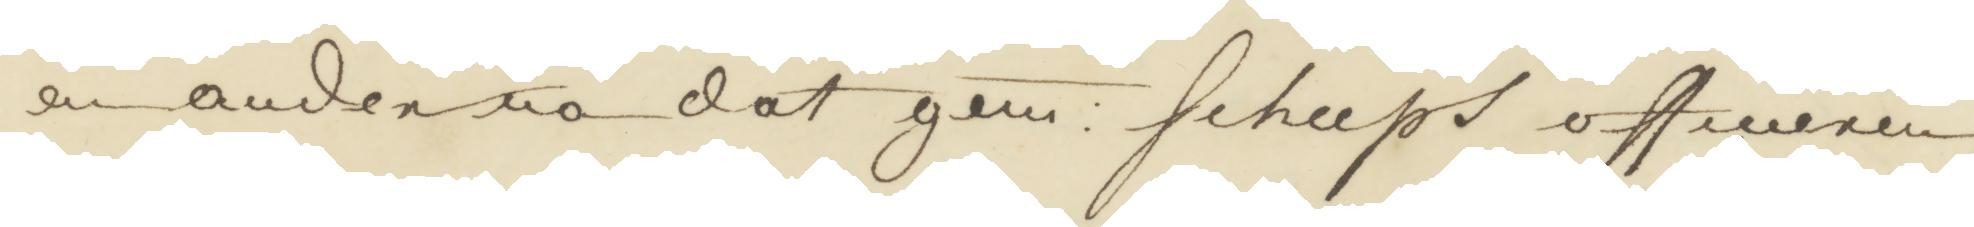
en ander na dat gem: scheeps officieren
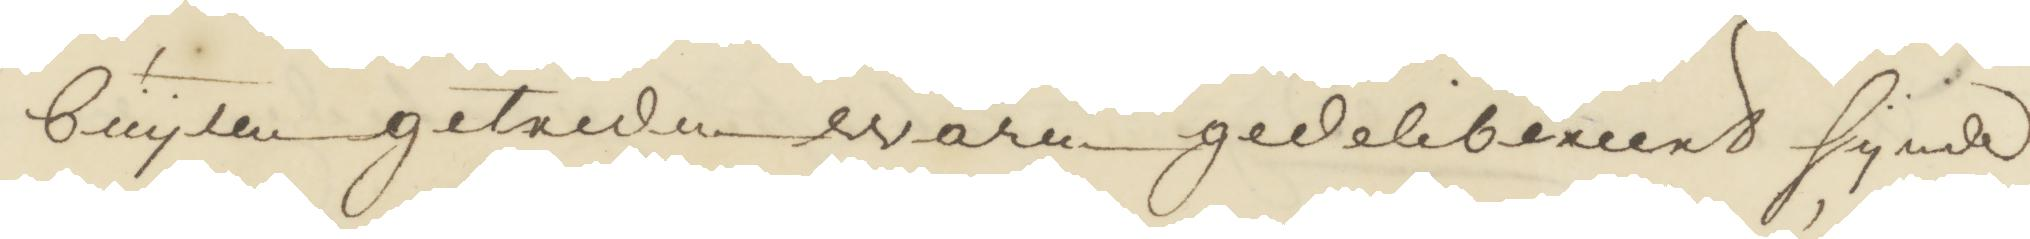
buijten getreden waren gedelibereert sijnde
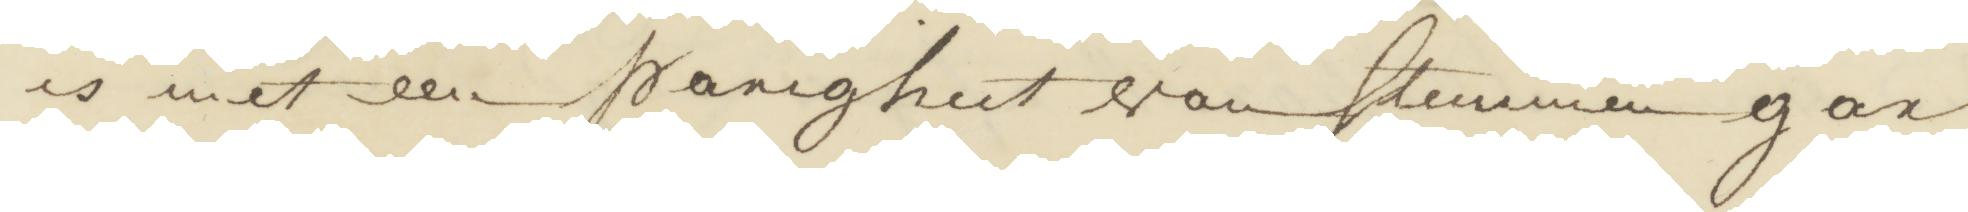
is met een parigheit van stemmen g'ar
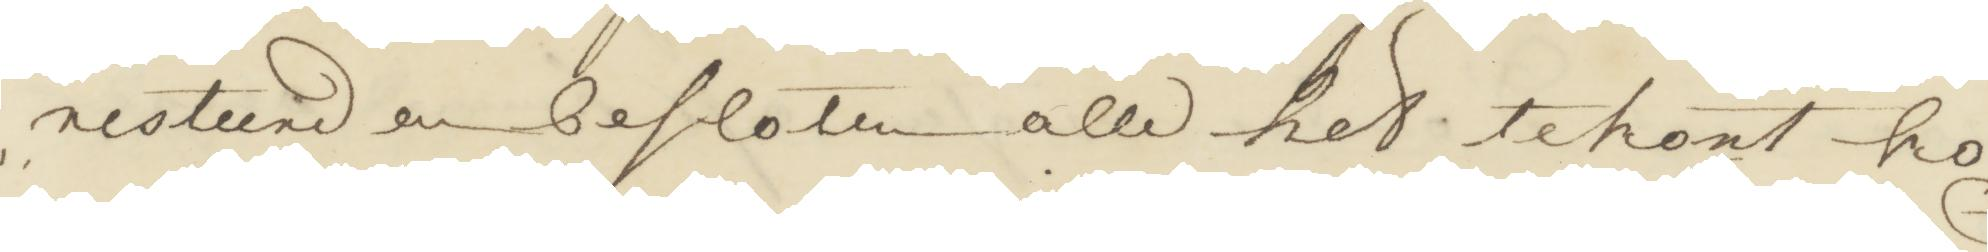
„resteerd en besloten alle het te kort ko
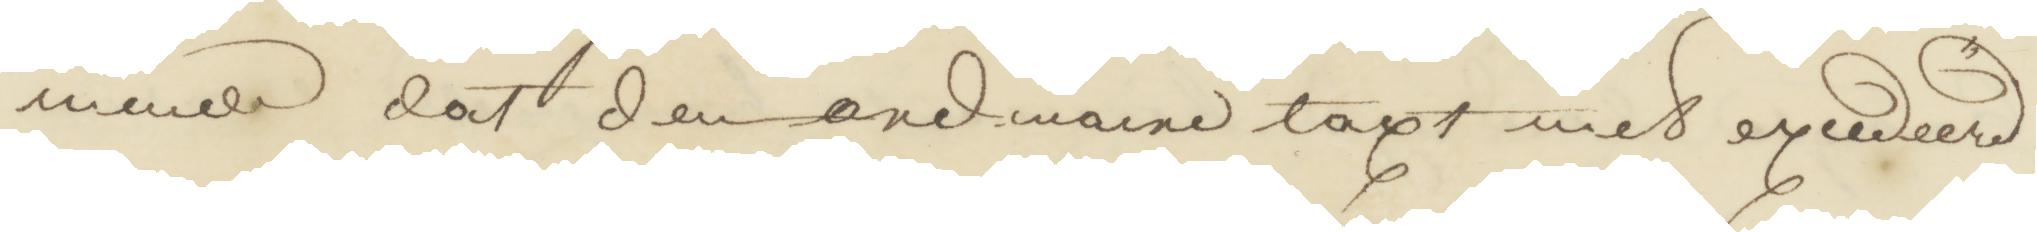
mende dat den ordinaire taxt niet excedeerd
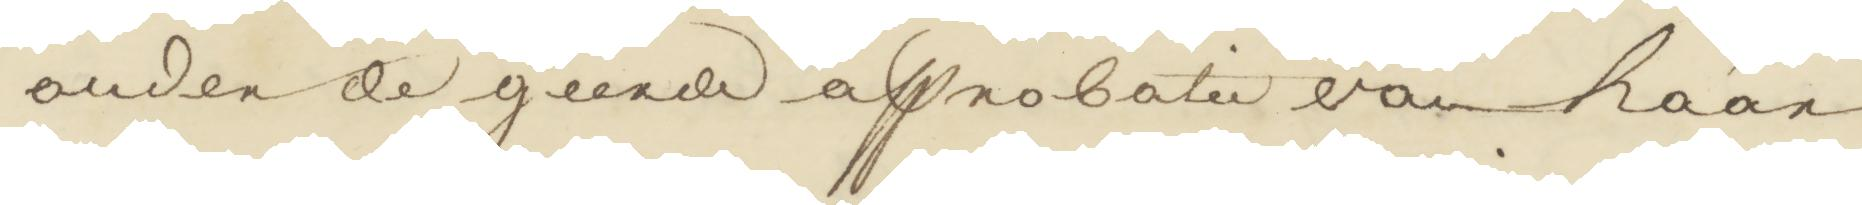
onder de g'eerde approbatie van haar
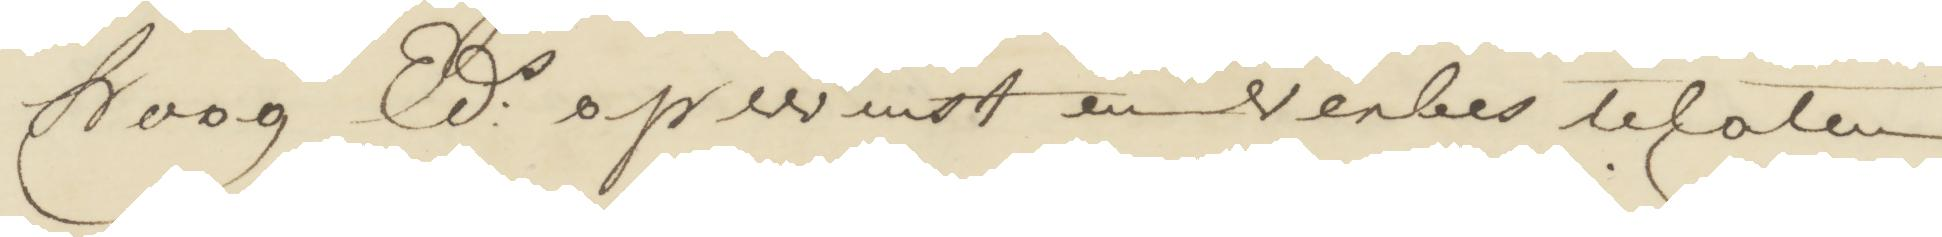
Hoog Ed:s op winst en verlies te laten
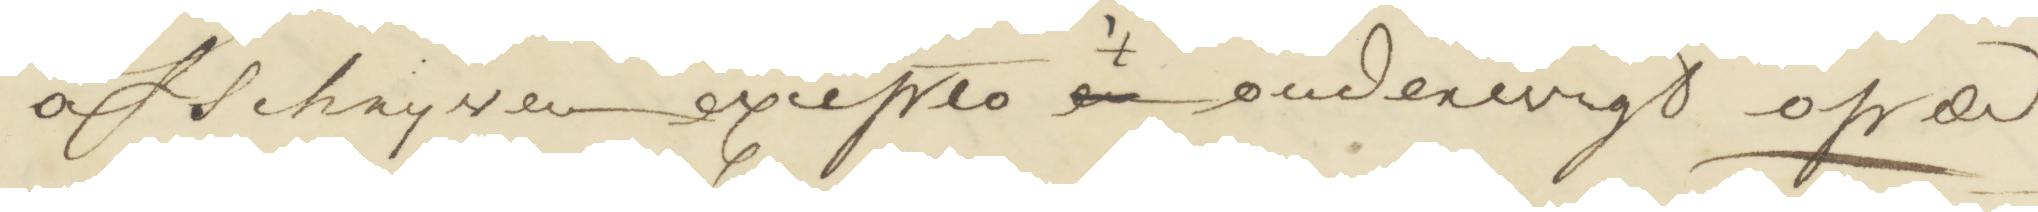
afschrijven excepto 't en onderwigt op de
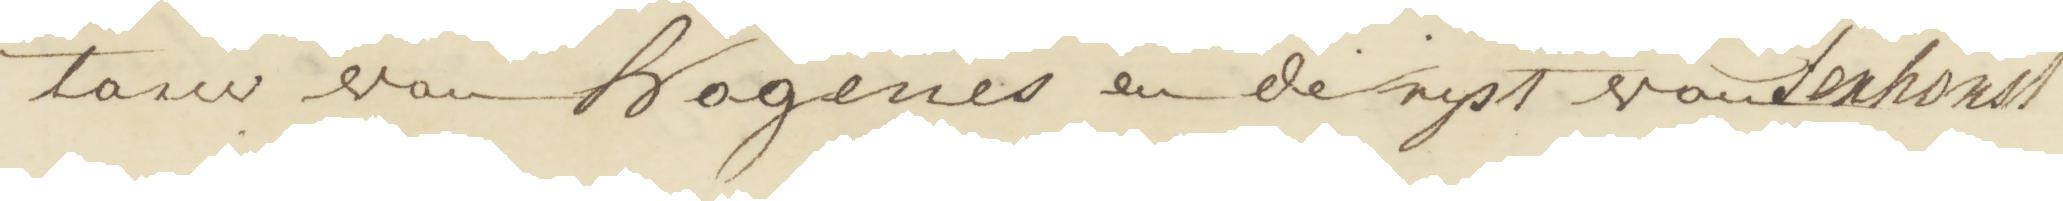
tarw van Hogenes en de rijst van Terhorst
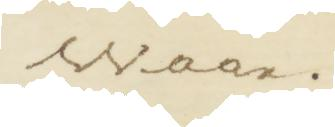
waar.
